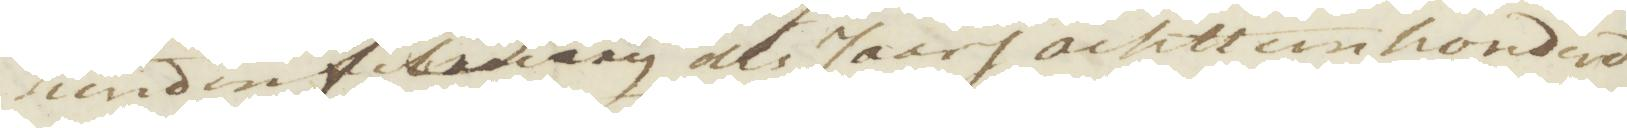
tienden february des Jaars achttienhonderd
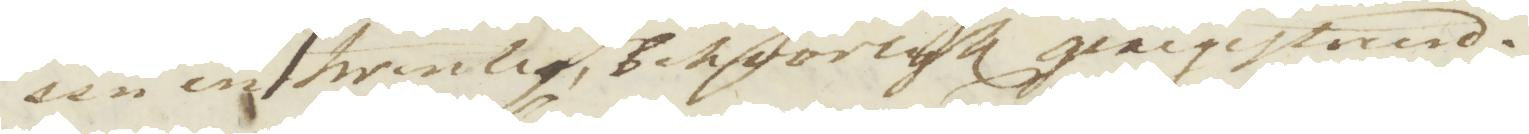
een en twintig, behoorlyk geregistreerd.
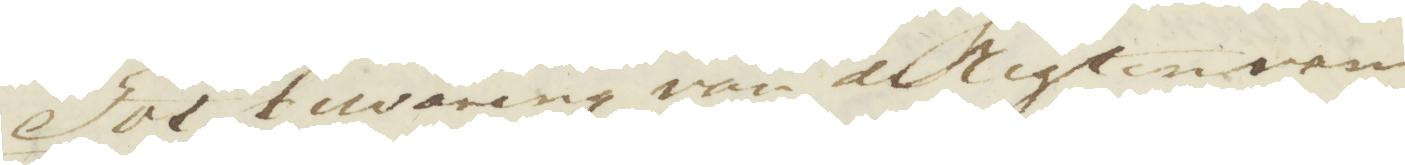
Tot bewaring van de Regten van
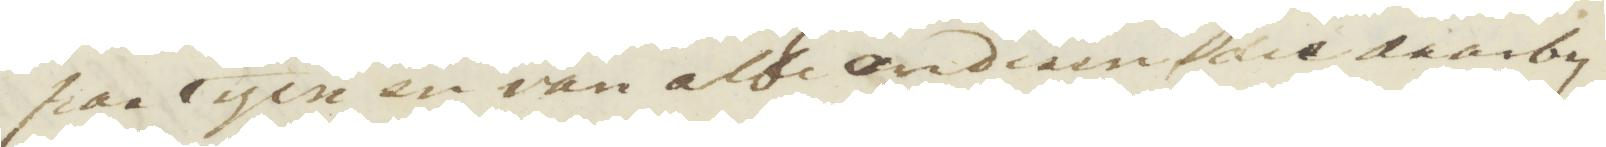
partyen en van alde anderen die daarby
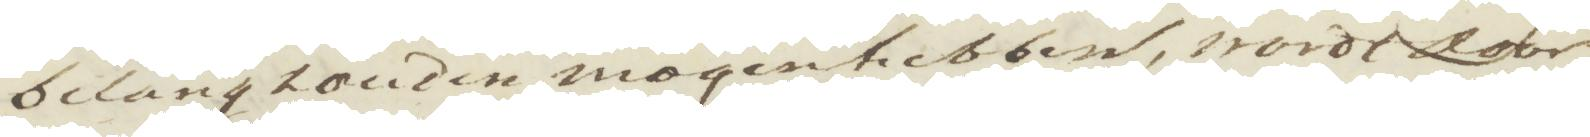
belang zouden mogen hebben, wordt voor
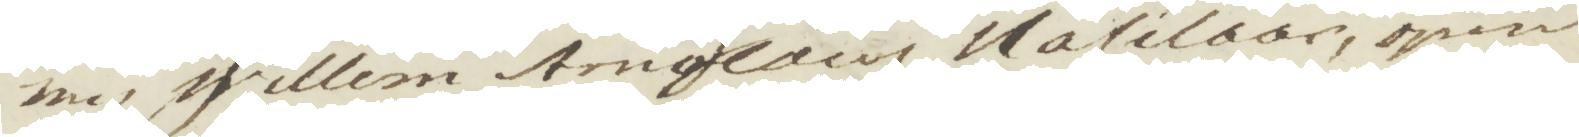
my, Willem Arnoldus Haselaar, open
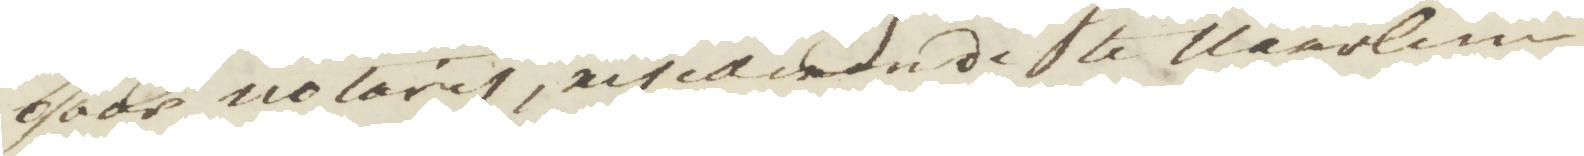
baar notaris, residerende te Haarlem
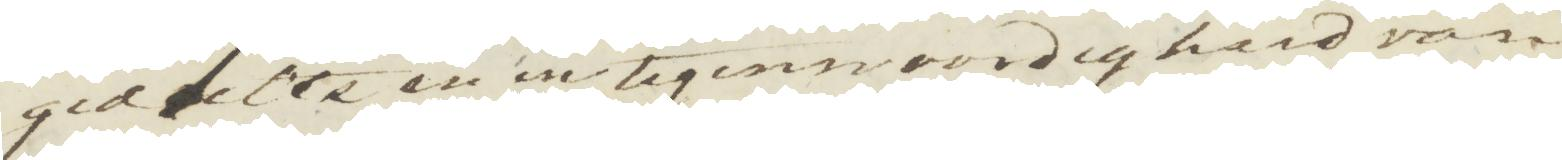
gedeelte en in tegenwoordigheid van
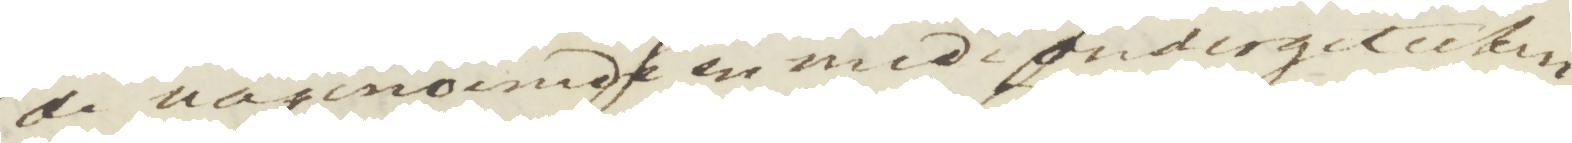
de nagenoemde en mede ondergeteeken
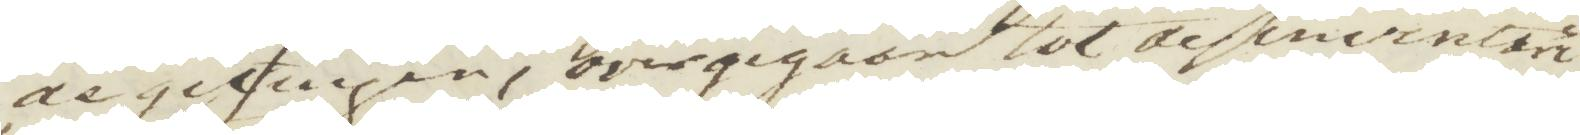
,de getuigen, overgegaan tot de inventari
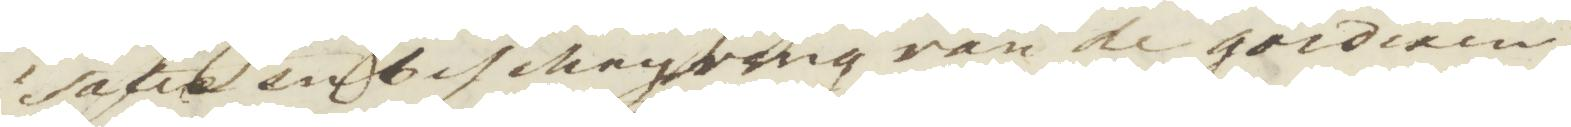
„satie en beschryving van de goederen,
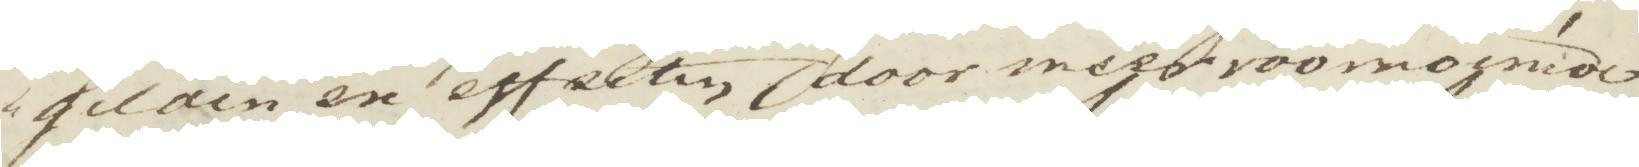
gelden en effecten door meervoornoemde
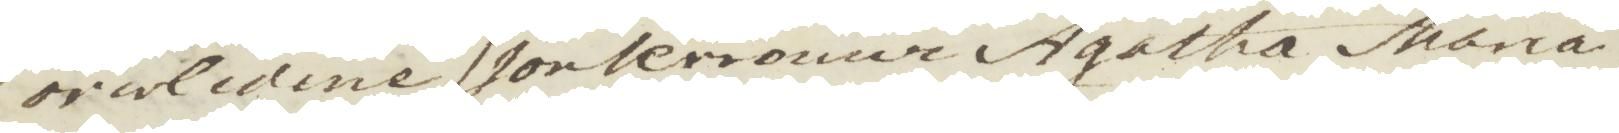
overledene Jonkvrouwe Agatha Maria
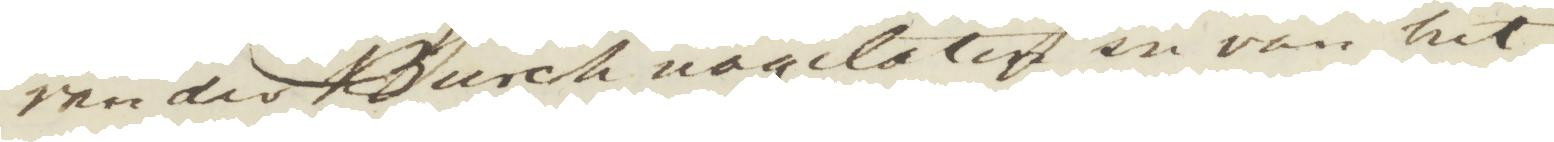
van der Burch nagelaten en van het
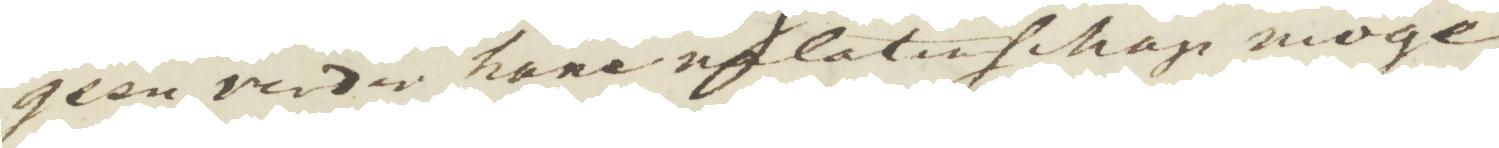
geen verder hare nalatenschap moge
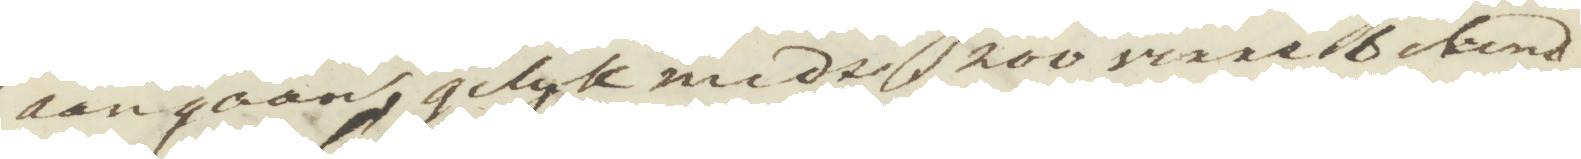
aan gaan, gelyk midts zoo verre bekend
